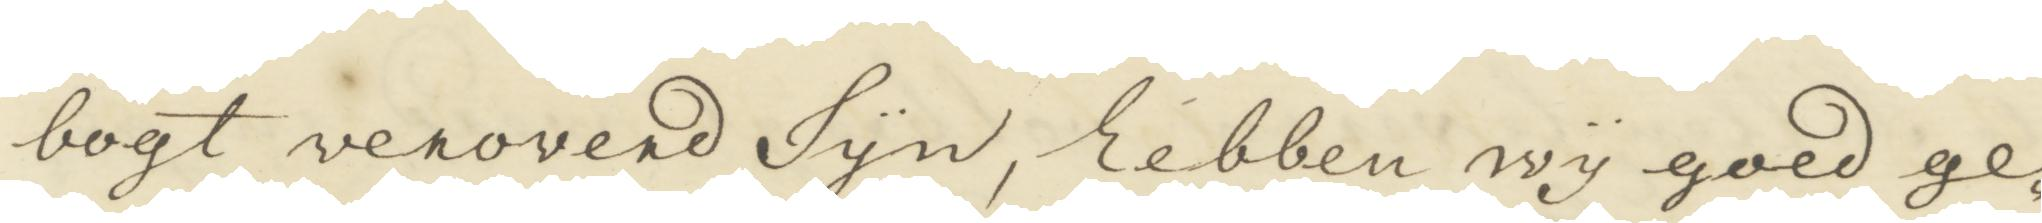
bogt veroverd Sijn, hebben wij goed ge„
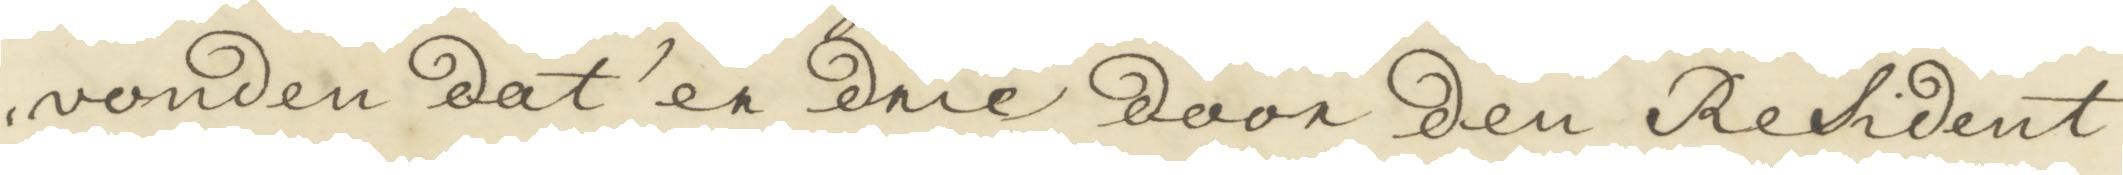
„vonden dat 'er drie door den Resident
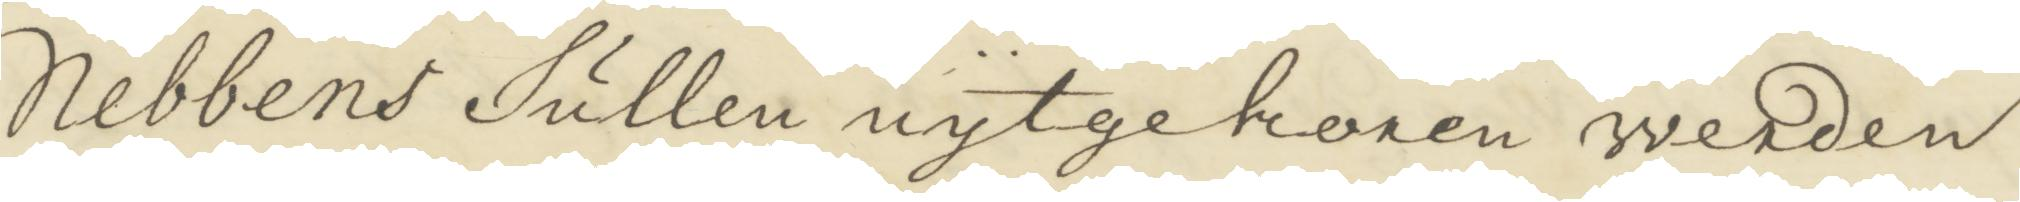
Nebbens Sullen uijtgekoren werden
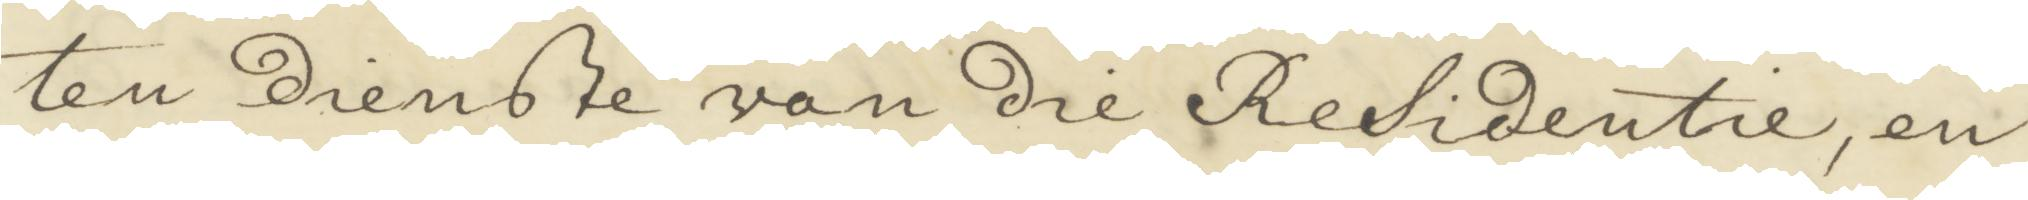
ten dienste van die Residentie, en
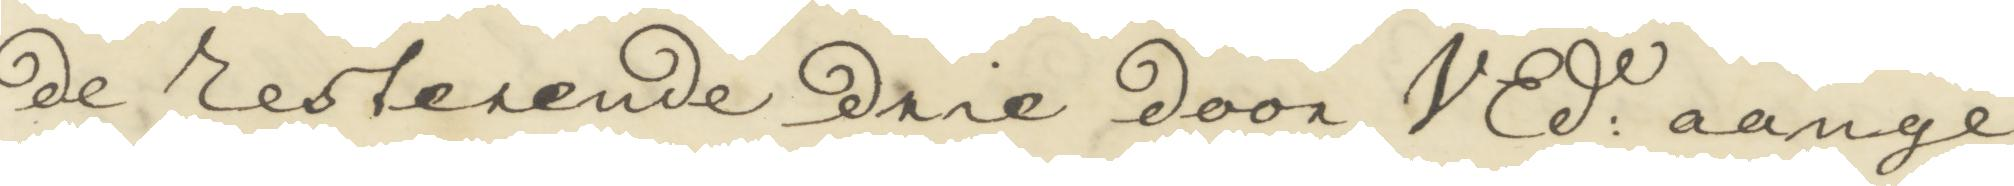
de Resterende drie door V Ed:e aange
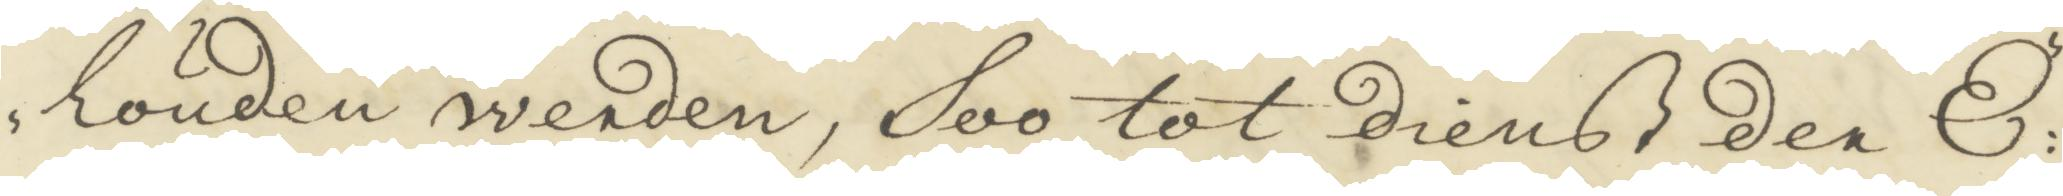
„houden werden, Soo tot dienst der E.
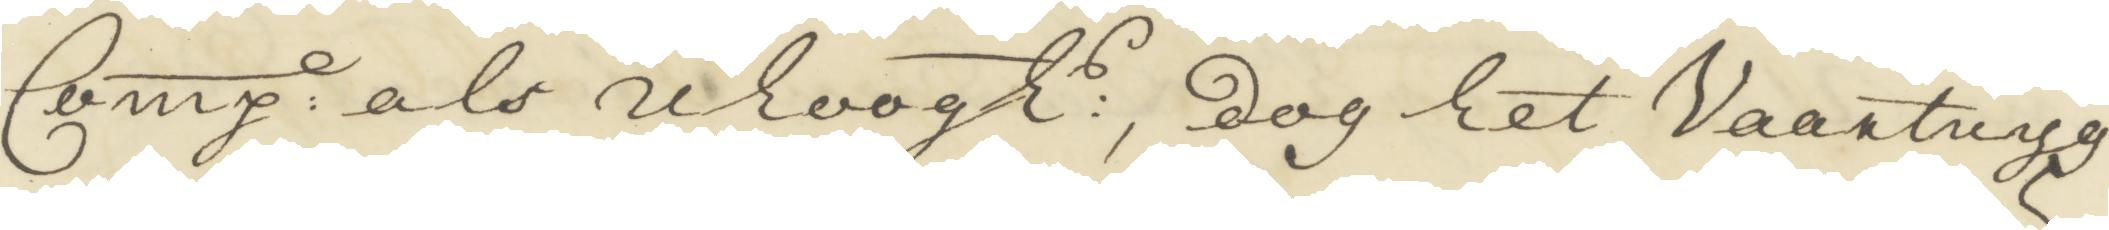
Comp:e als u hoogh:s, dog het Vaartuijg
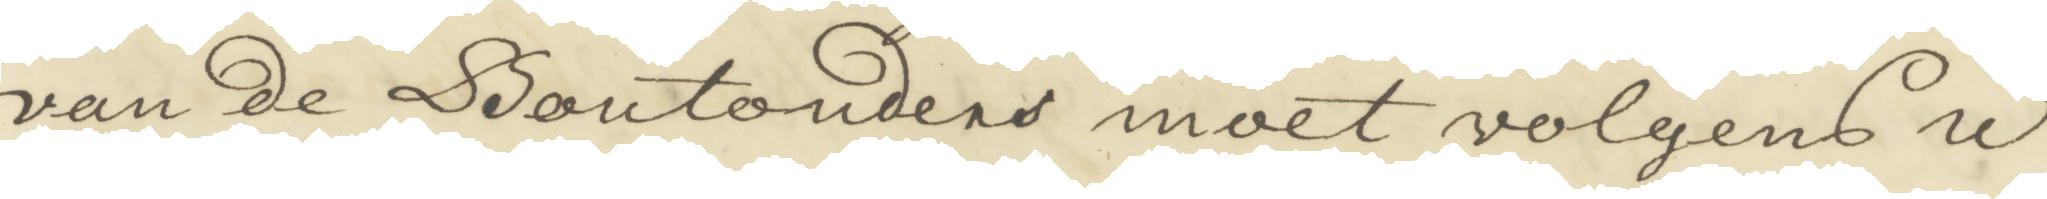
van de Boutonders moet volgens u
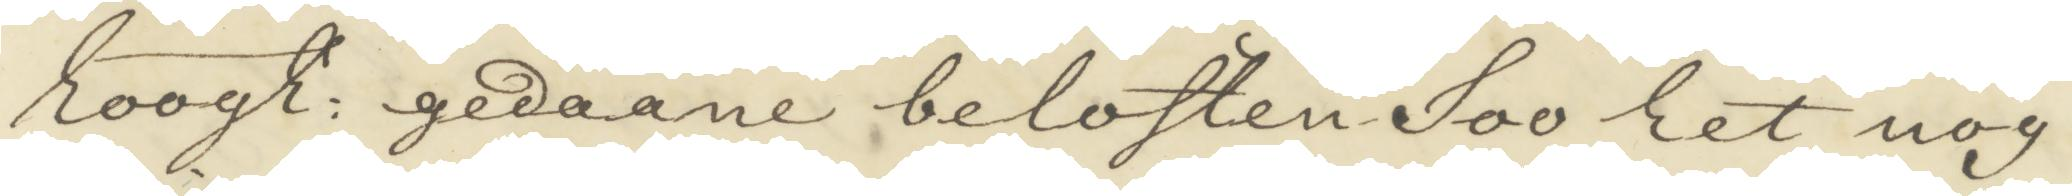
hoogh:s gedaane beloften Soo het nog
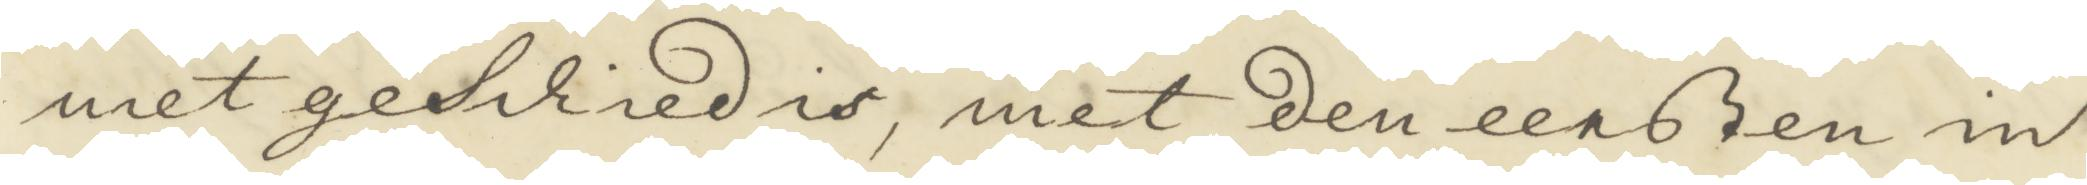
niet geschied is, met den eersten in
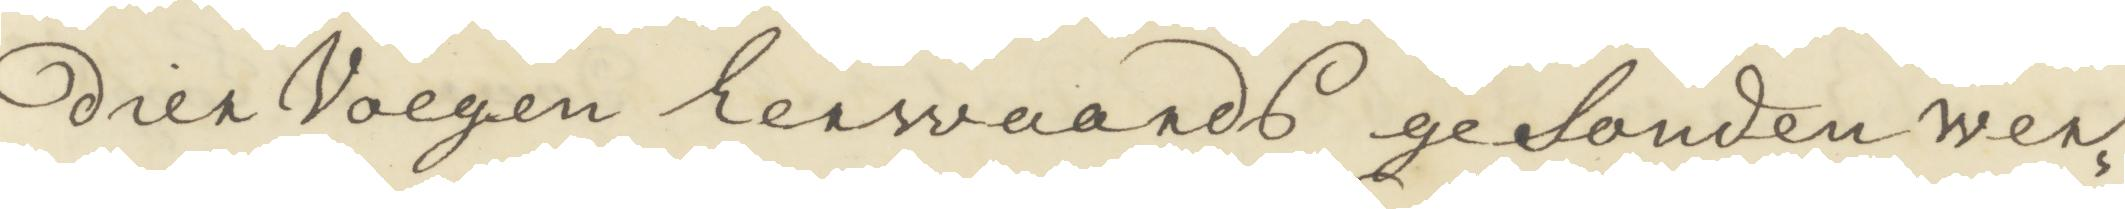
dier Voegen herwaards gesonden wer„
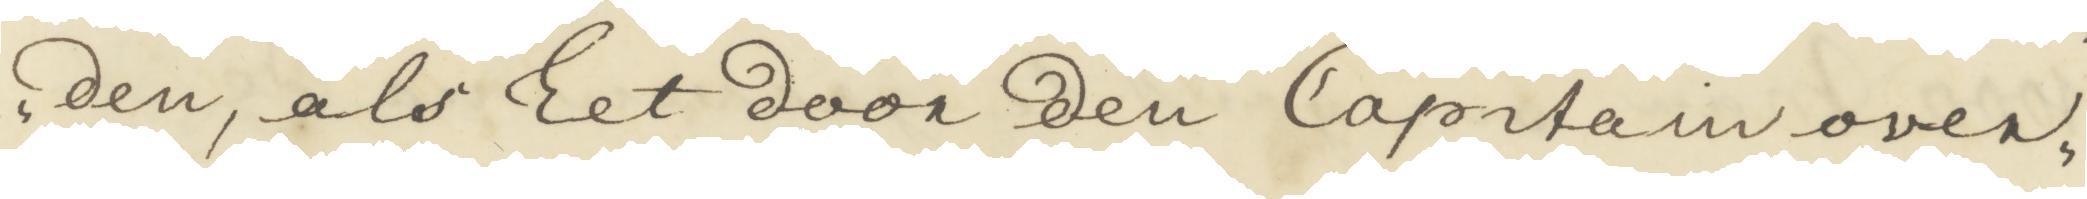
„den, als het door den Capitain over„
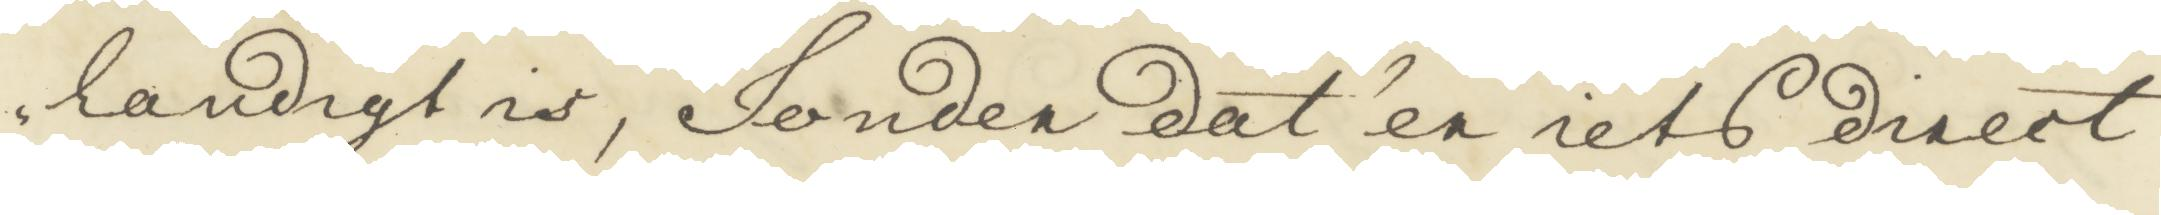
„handigt is, Sonder dat 'er iets direct
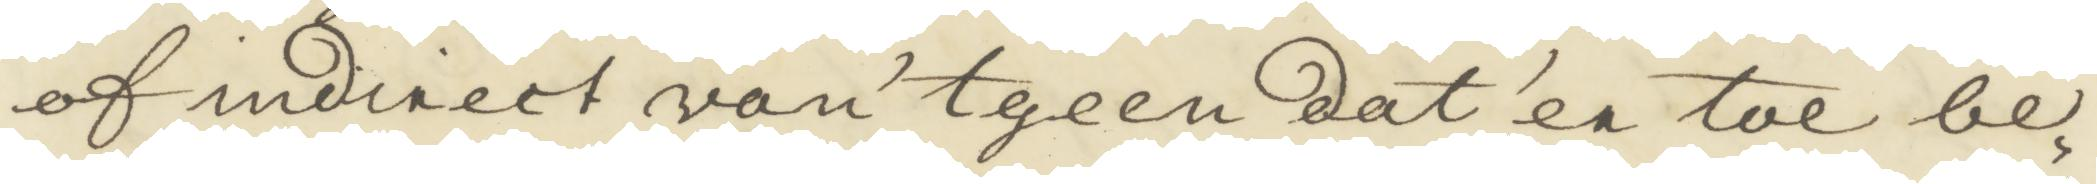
of indirect van ’t geen dat 'er toe be„
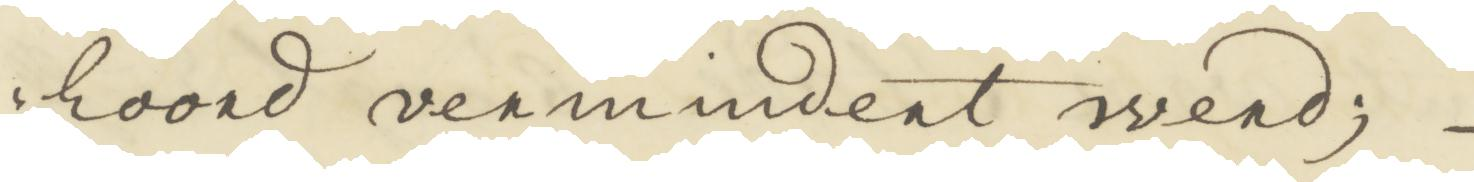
„hoord vermindert werd;-
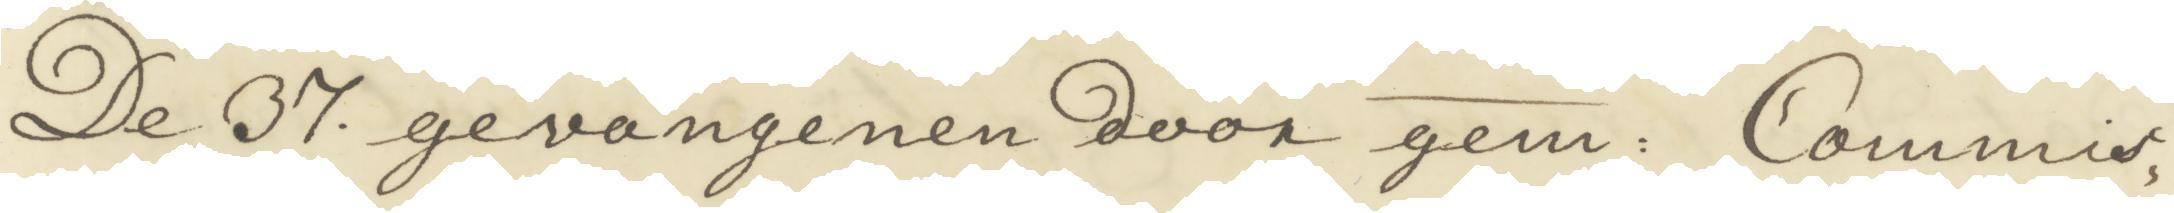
De 37. gevangenen door gem: Commis„
